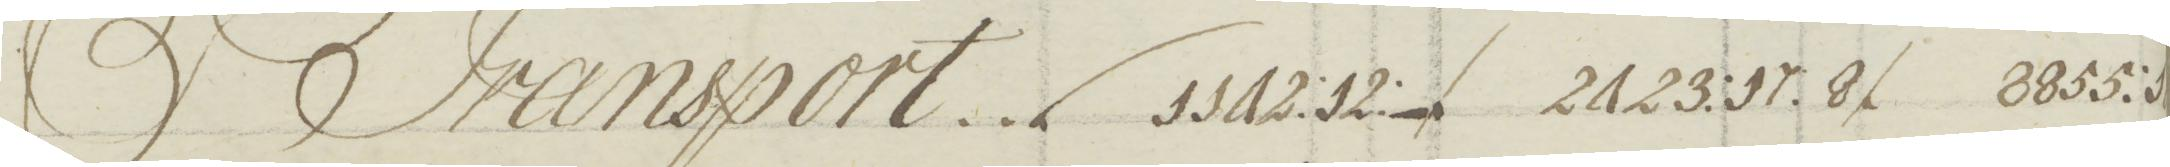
P Transport . . ƒ 1142:12:–ƒ 2423:17. 8ƒ 3855:1
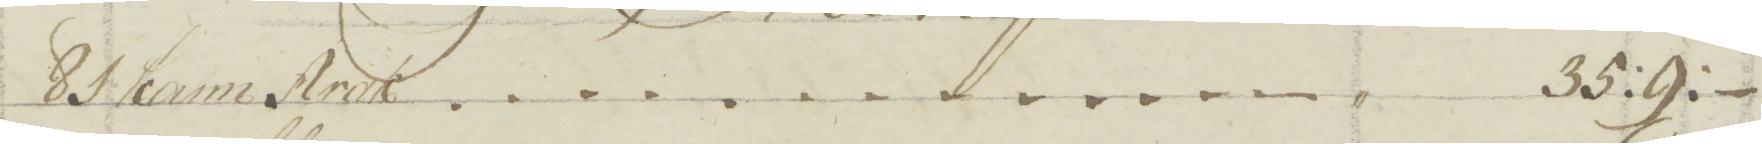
81 kann Arak . . - - . - - - - - - - - - „ 35:9:–
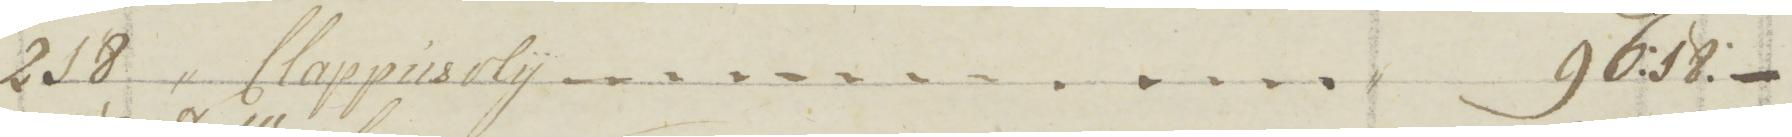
218 „ Clappus olij - - - - - - - - . - . . . „ 96:18:–
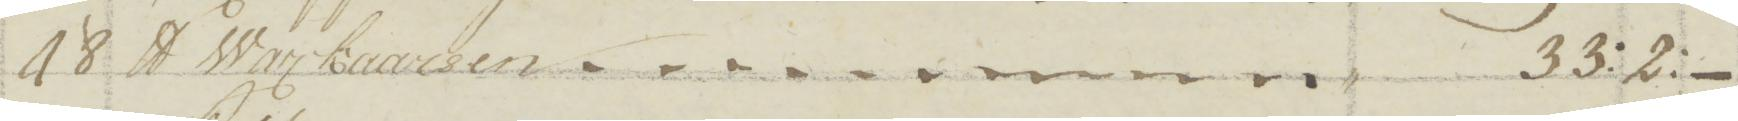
48 lb Wax kaarsen - - - - - - - - - - - - - „ 33:2:–
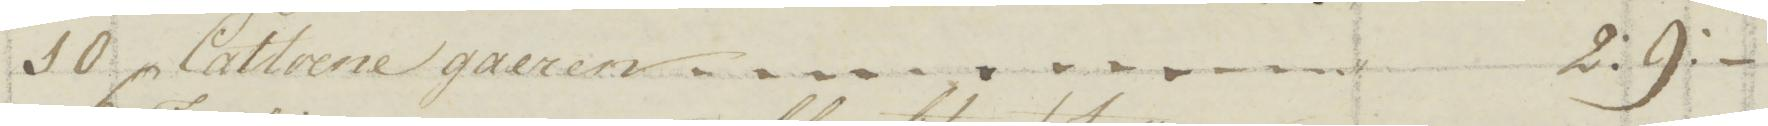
10 „ Cattoene gaeren - - - - - . - - - - - - . „ 2: 9: –
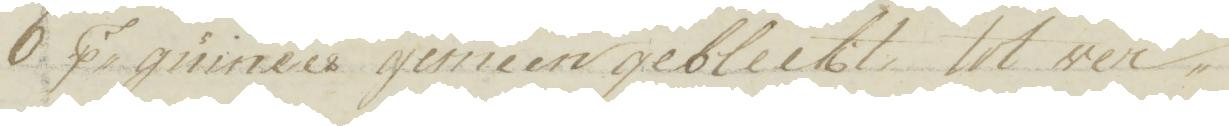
6 p„s guinees gemeen gebleekt, tot ver„
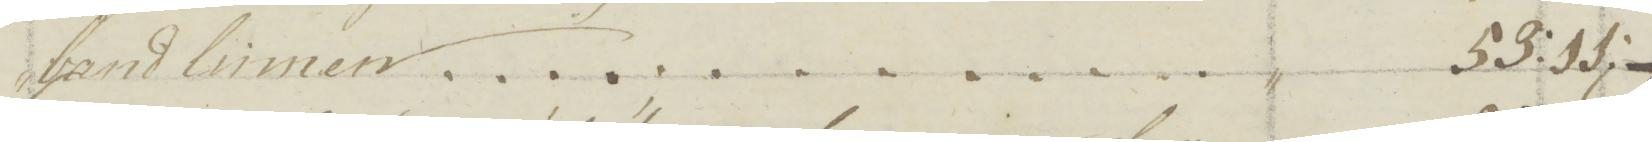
„band linnen . . . . . . . . . . . . . „ 53:11:–
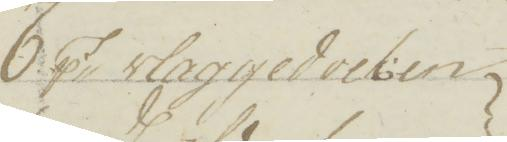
6 p„s vlaggedoeken
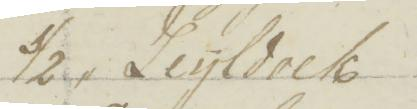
½ „ zeijldeek
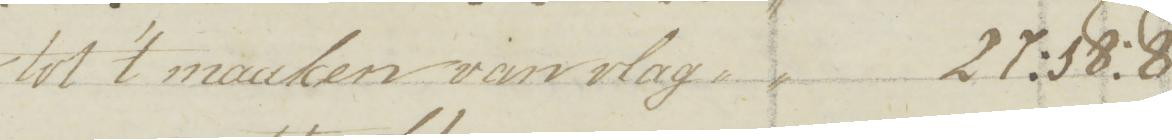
tot ’t maaken van vlag „ „ 27:18:8
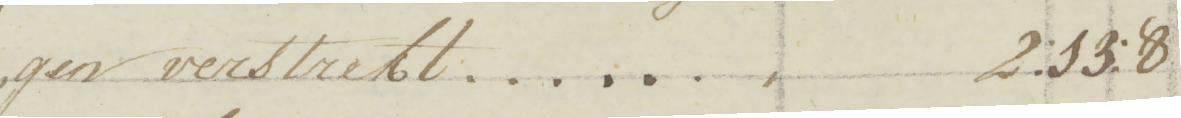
,gen verstrekt . . . . . . „ 2:13:8
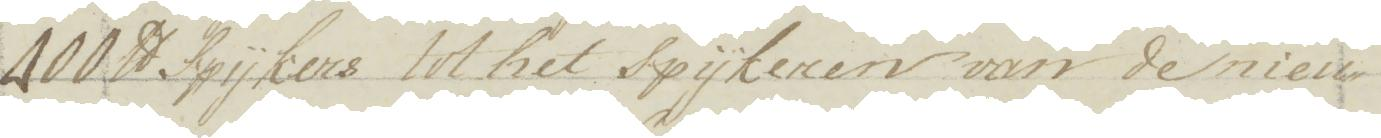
400 lb spijkers tot het spijkeren van de nieu
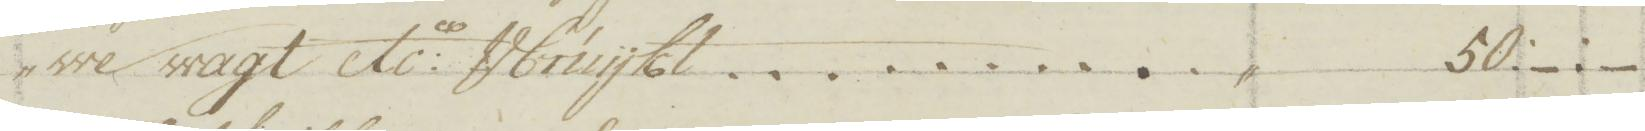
„we wagt etc:a verbruijkt . . . . . . . . . . „ 50: – : –
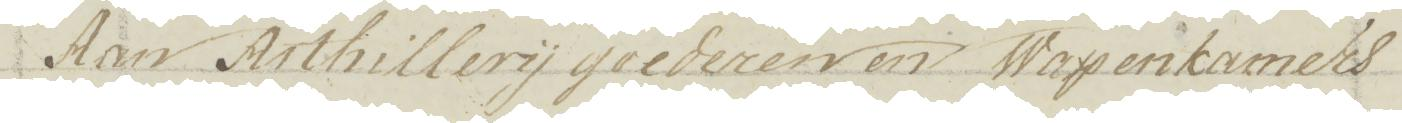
Aan Arthillerij goederen en wapenkamers
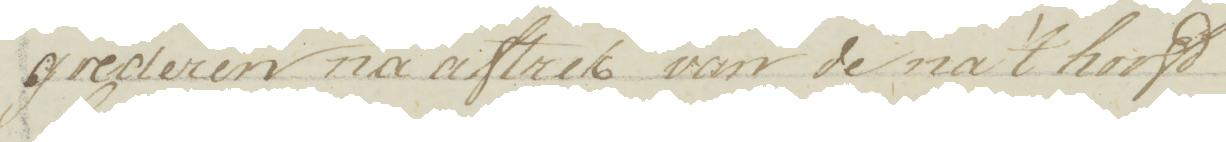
goederen na aftrek van de na ’t hoofd
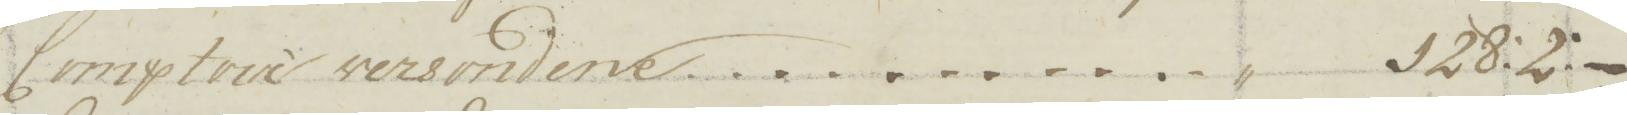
Comptoir versondene . . . . - - - - - . - „ 128: 2: –
